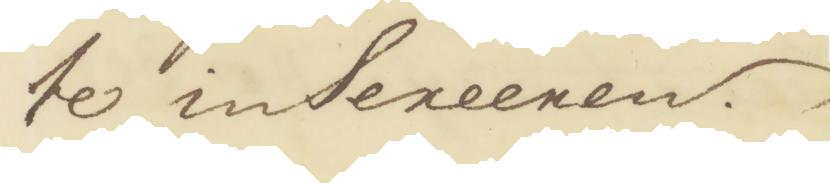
te insereeren.
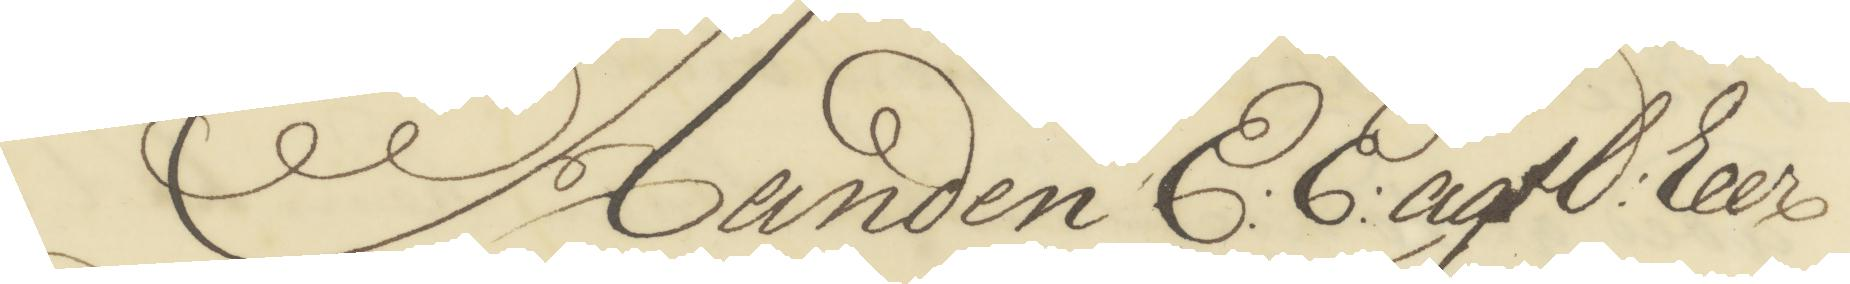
Aanden E: E: agtb: heer
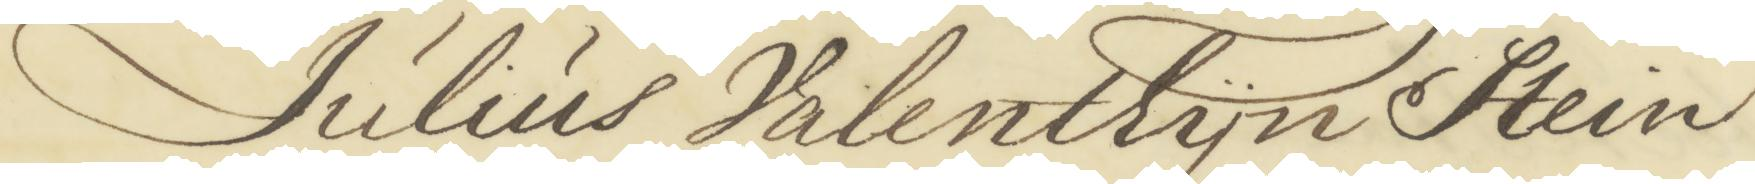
Iulius Valenthijn Stein
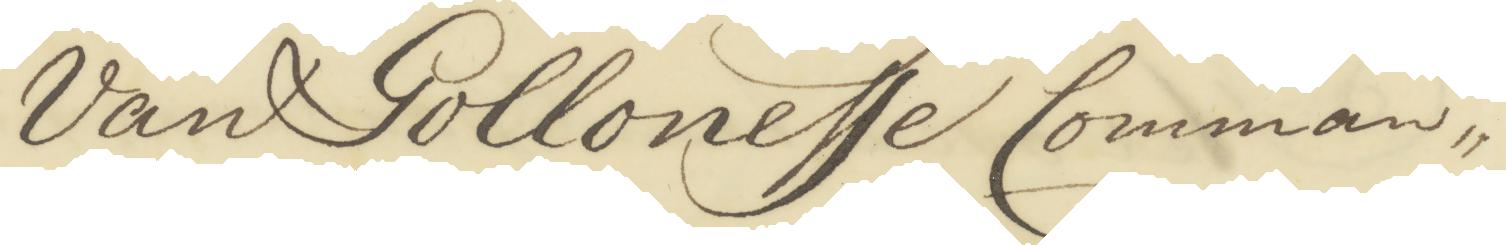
Van Gollonesse Comman„
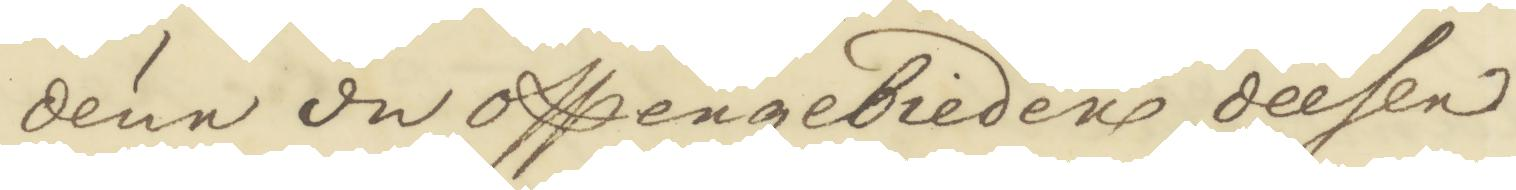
deur en oppergebieder deeser
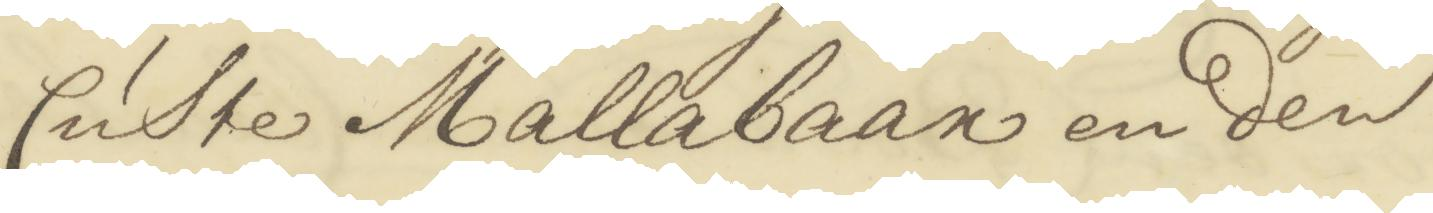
Custe Mallabaar en den
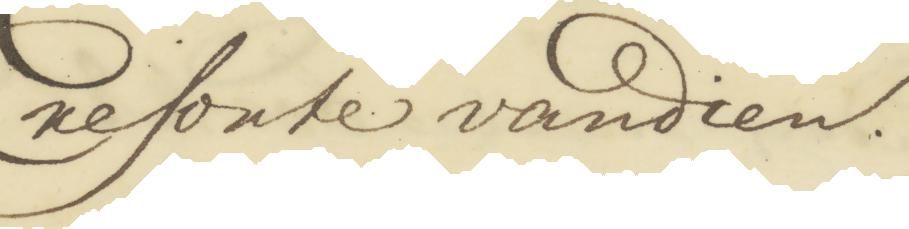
resorte vandien.
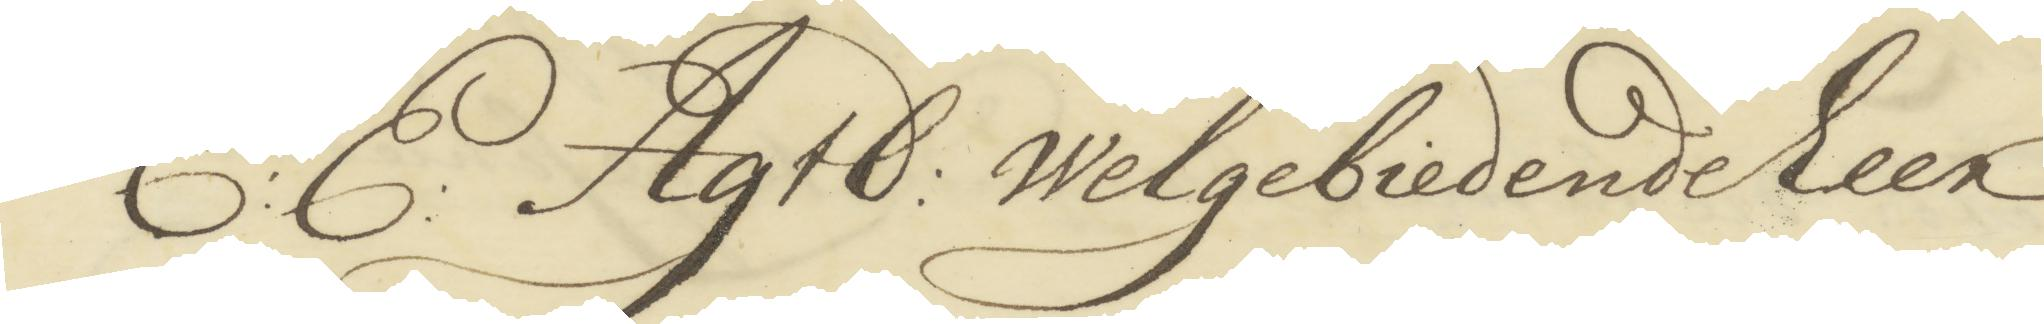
E: E: Agtb: welgebiedende heer
